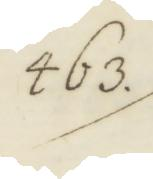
463.
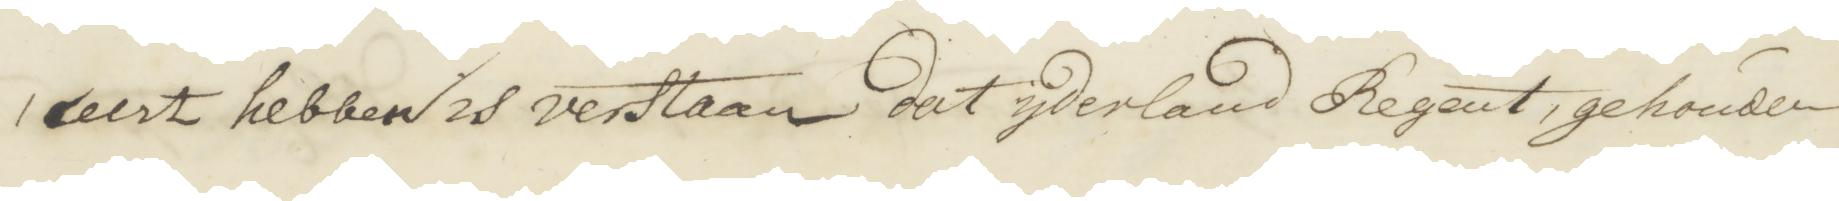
/ ceert hebben / is verstaan dat ijder land Regent, gehouden
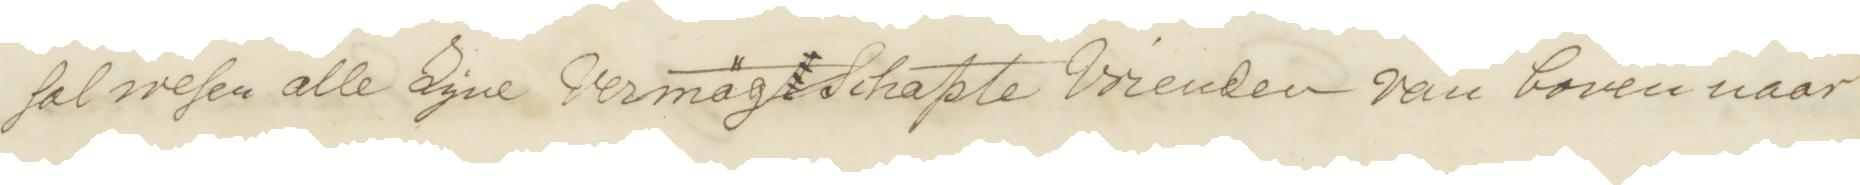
sal wesen alle zijne vermögtschapte vrienden van boven naar
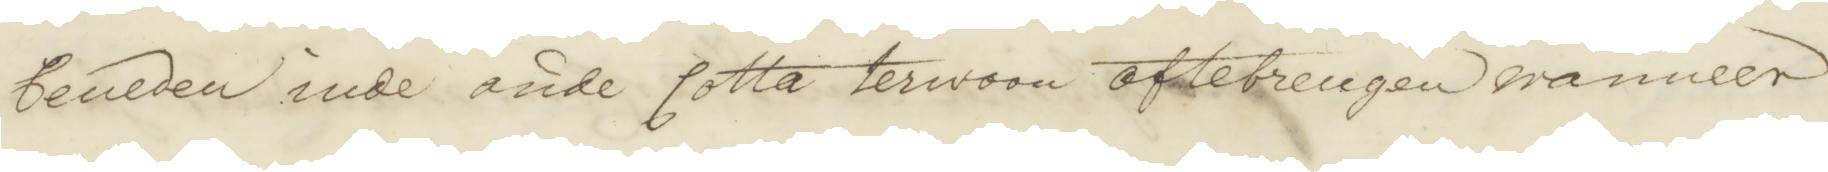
beneden inde oude Cotta terwoon aftebrengen wanneer
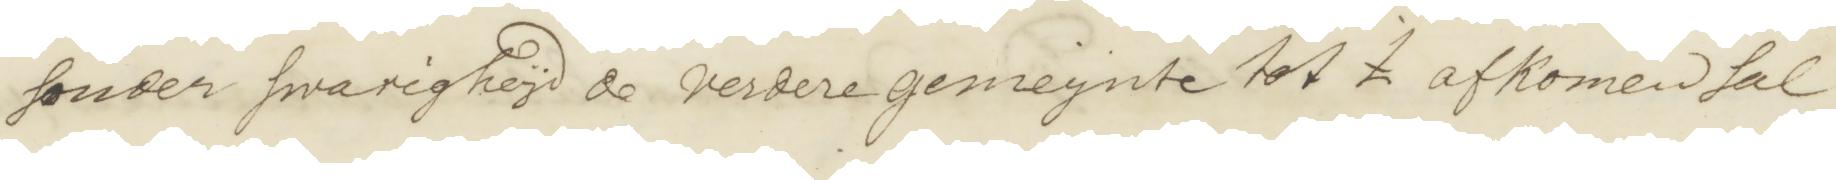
sonder swarigheijd de verdere gemeijnte tot ’t afkomen sal
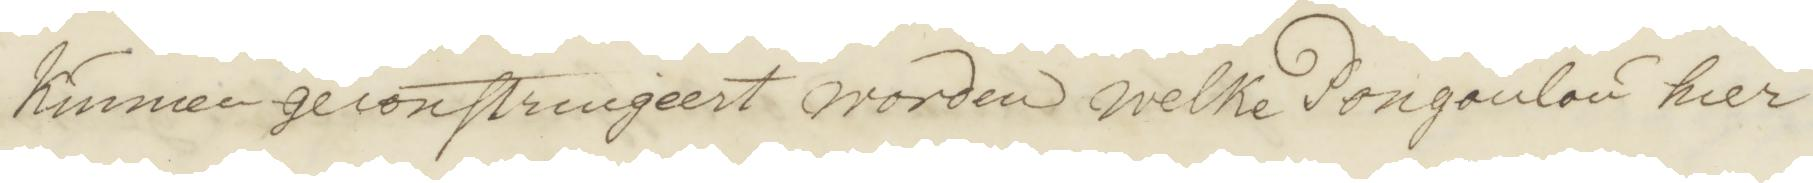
kunnen geconstringeert worden welke Pongoulou hier
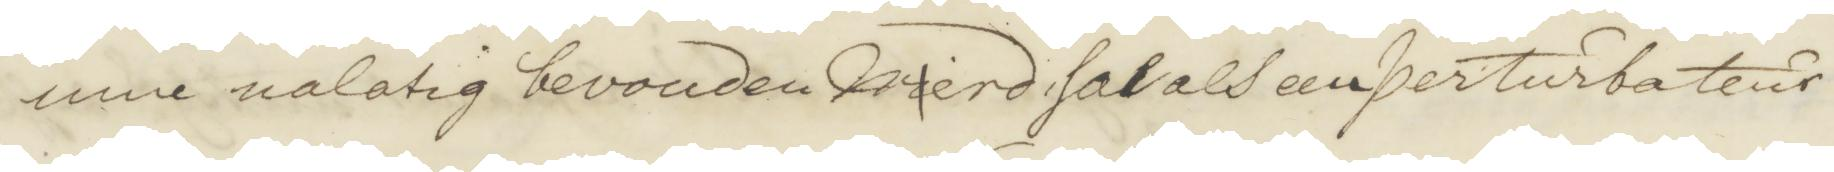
inne nalatig bevonden wierd, sal als een perturbateur
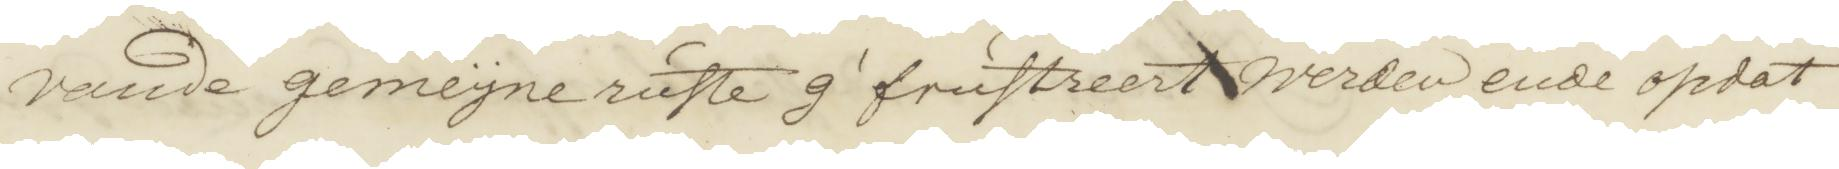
vande gemeijne ruste g’frustreert werden ende opdat
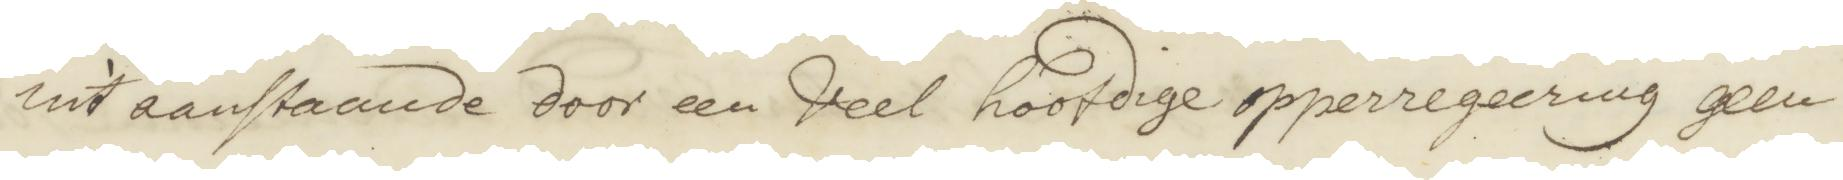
in 't aanstaande door een veel hoofdige opperregeering geen
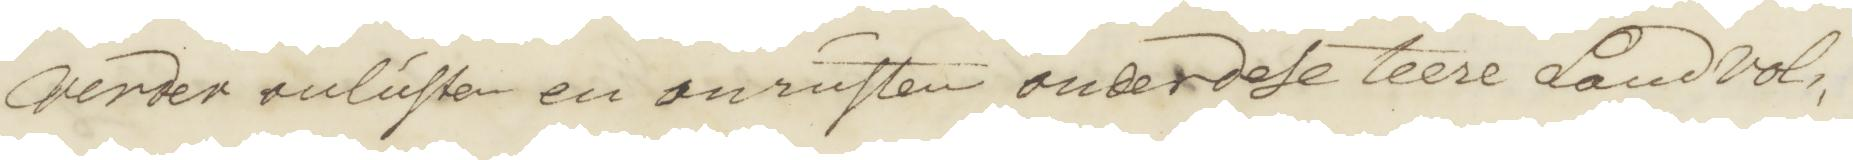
verder onlusten en onrusten onder dese teere Land vol„
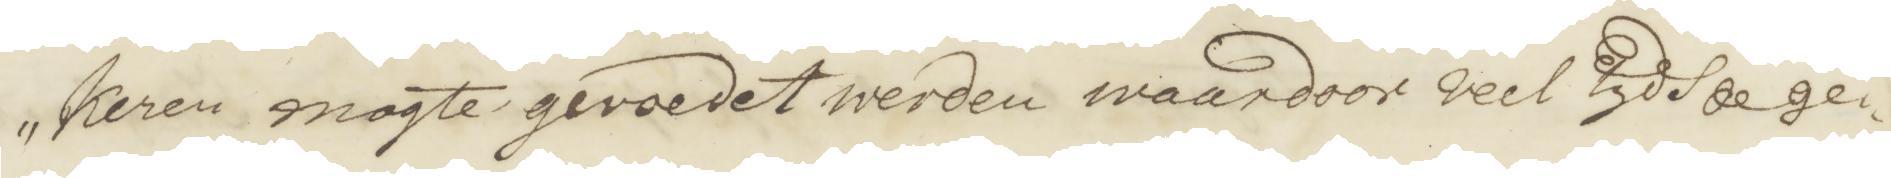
„keren mogte, gevoedet werden waardoor veel tyds de ge
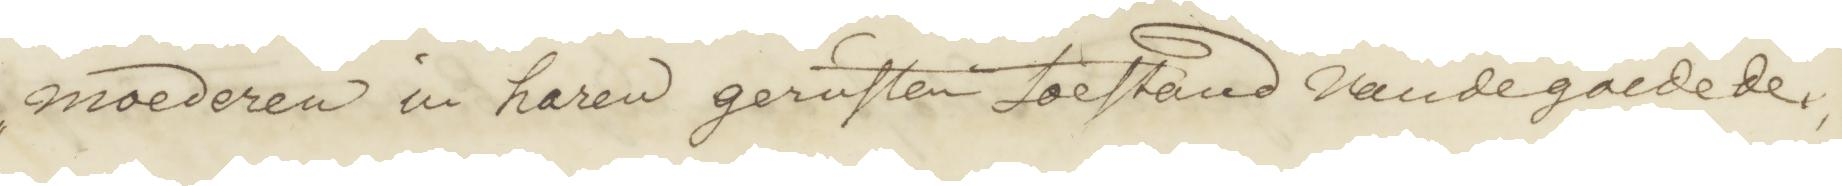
„moederen in haren gerusten toestand vande goede de„
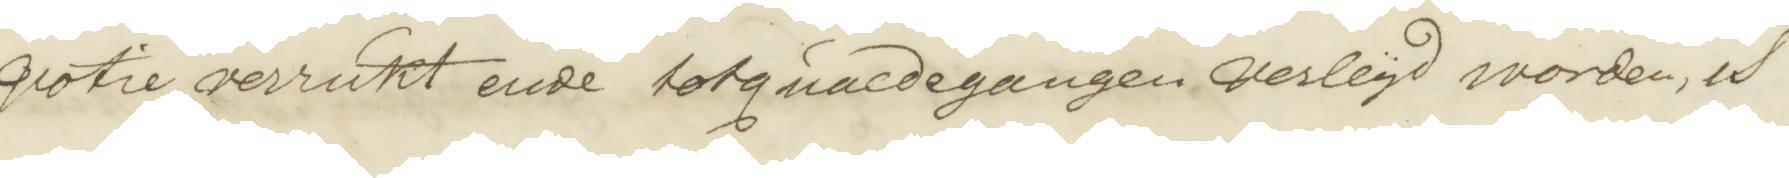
qiotie verrukt ende tot quaede gangen verleijd worden, is
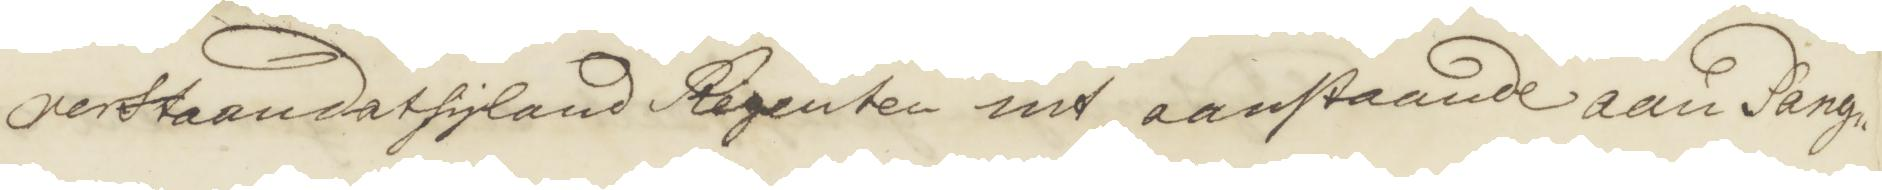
verstaan dat sijland Regenten in 't aanstaande aan Pang„
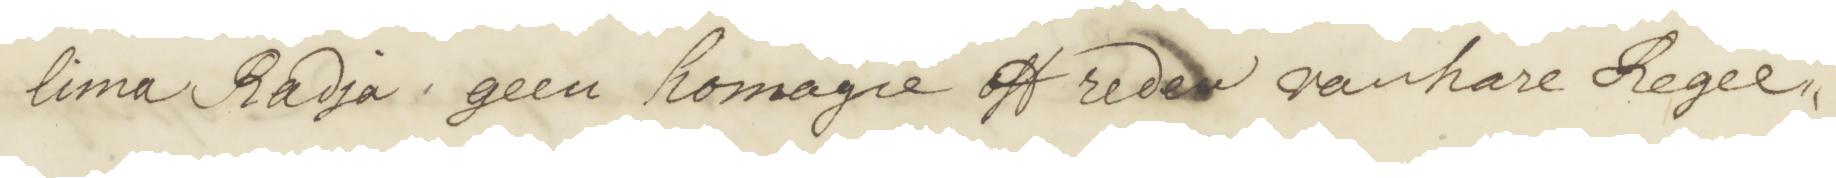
lima Radja, geen homagie off reder van hare Regee„
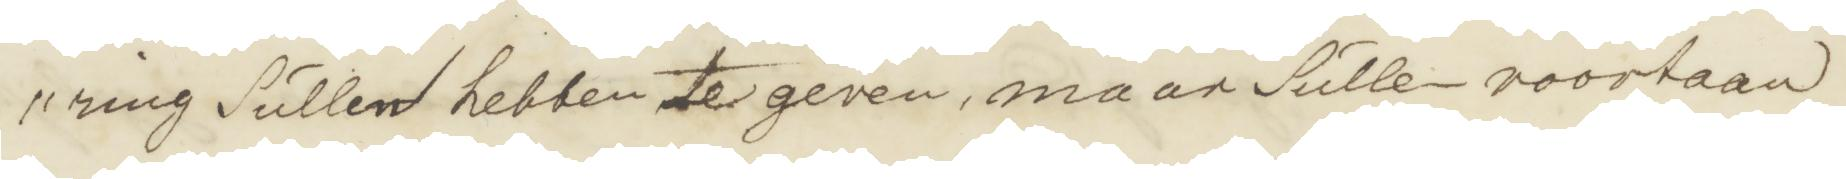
„ring sullen hebben te geven, maar sullen voortaan
